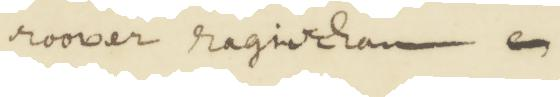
roover ragiechan en
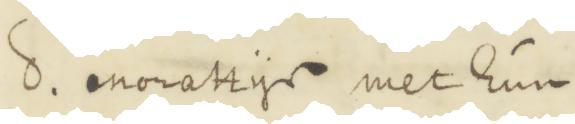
d. morattijs met hun
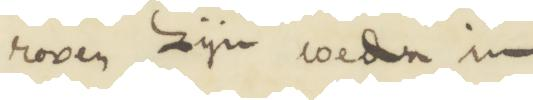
roven zijn weder in
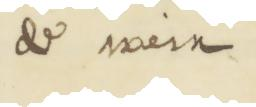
de weir
